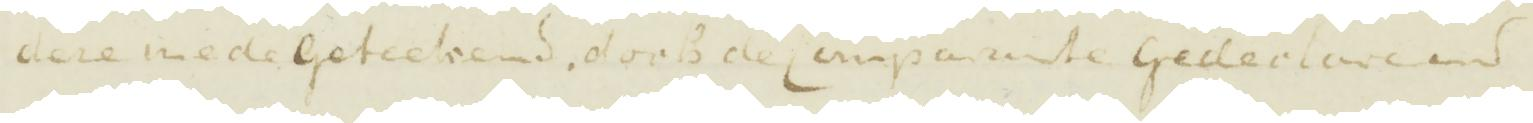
deze mede Geteekend, doch de Comparante Gedeclareerd
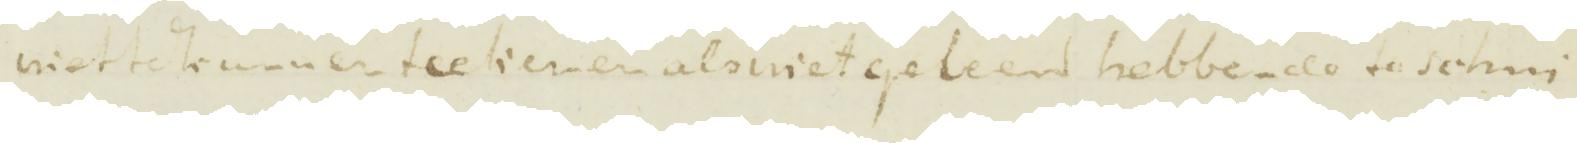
niet te kunnen teekenen als niet geleerd hebbende te schrij
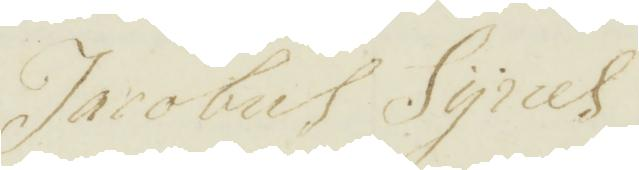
Jacobus Sijnes
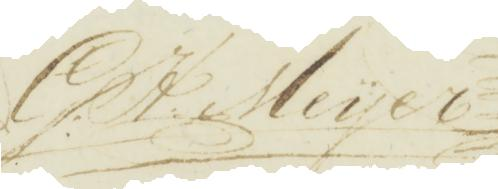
G.H. Meijer
